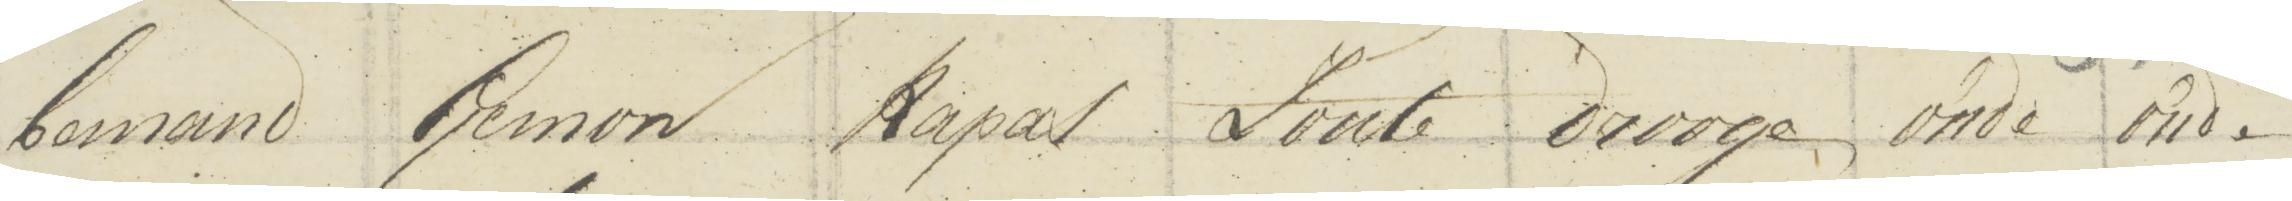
bemand Gemon kapas Soute drooge oude oude
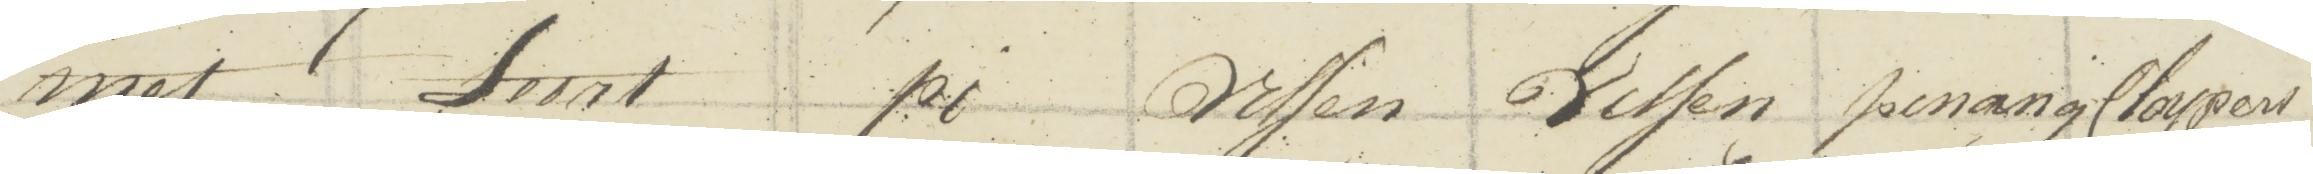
met teert pi vissen vissen penang Clappers
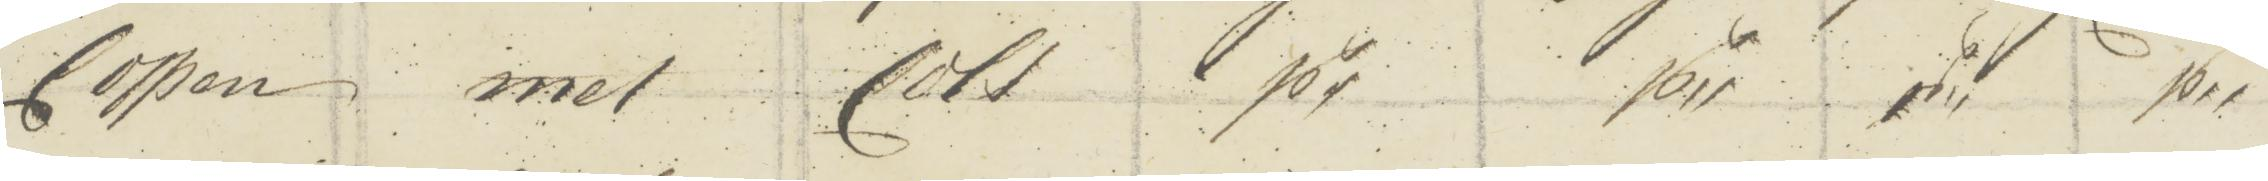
Coppen met Cols p„s p„s p„s p„s
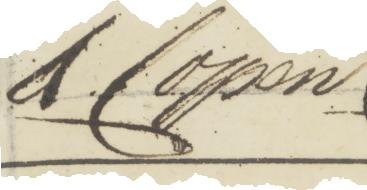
4. Coppen
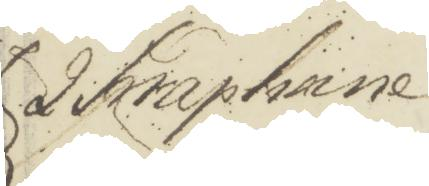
{ 2 snaphane
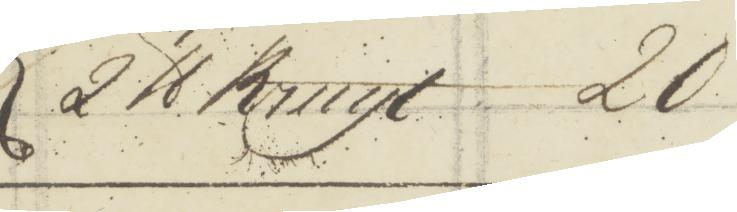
{ 2 lb kruyt 20
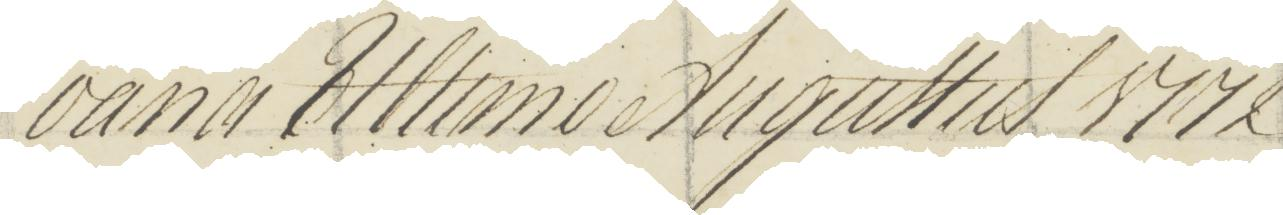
Joana Ultimo Augustus 1772
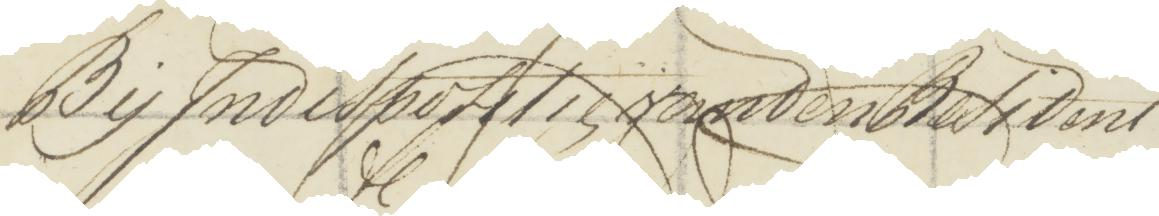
Bij Indispositien van den Resident
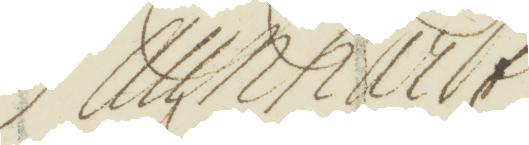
F Launhardt
